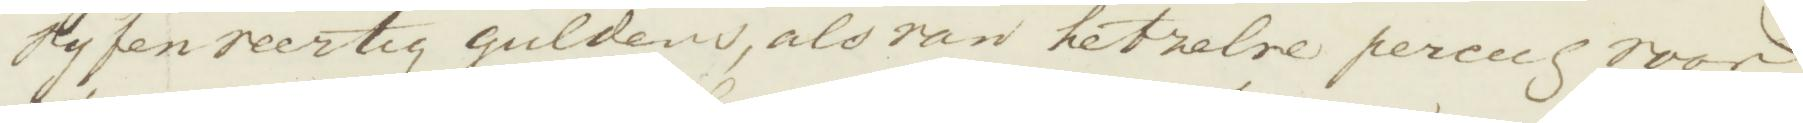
vyf en veertig guldens, als van hetzelve perceel voor
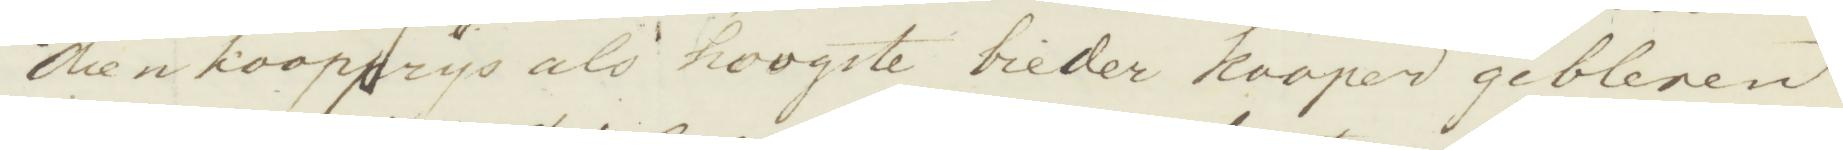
dien koopprys als hoogste bieder kooper gebleven
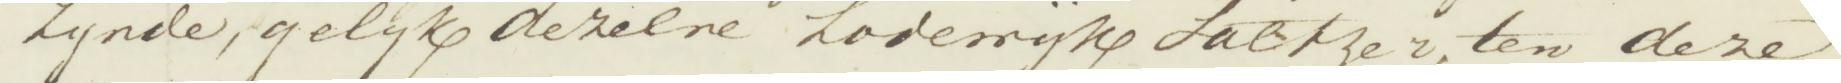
zijnde, gelyk dezelve Lodewijk saltzer, ten deze
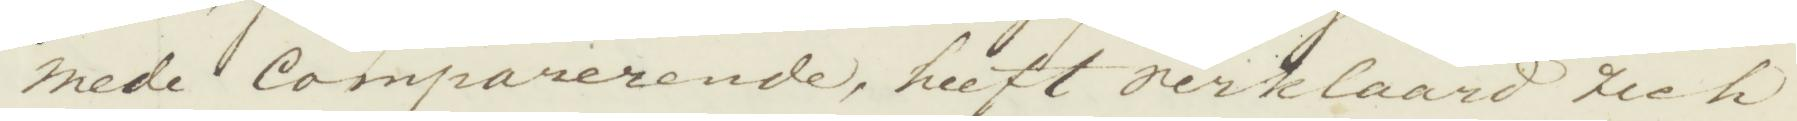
mede comparerende, heeft verklaard zich
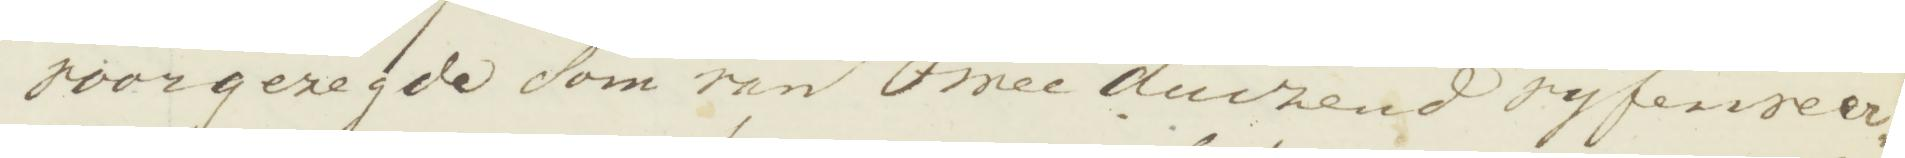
voor gezegde som van Twee duizend vyfenveer„
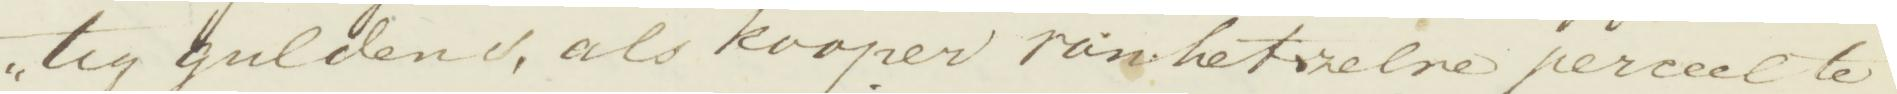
„tig guldens, als kooper van hetzelve perceel te
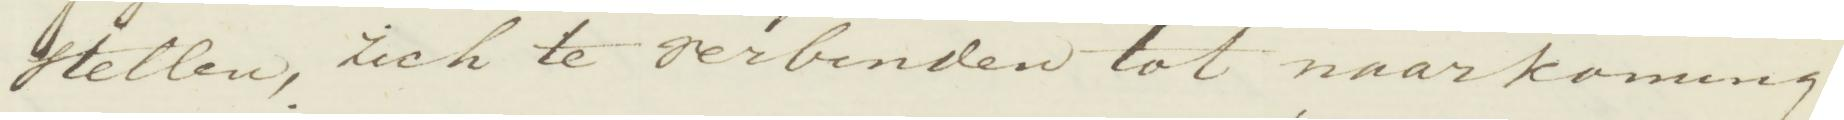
stellen, zich te verbinden tot naarkoming
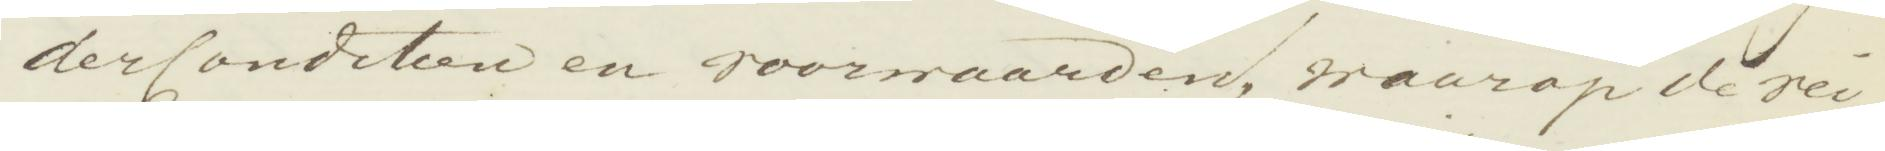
der Conditien en voorwaarden, waarop de vei
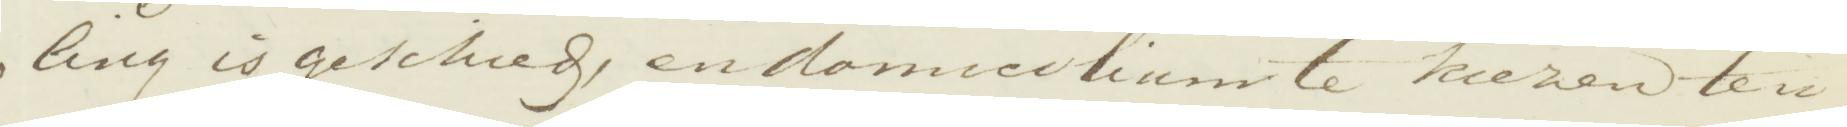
„ling is geschied, en domicilium te kiezen ten
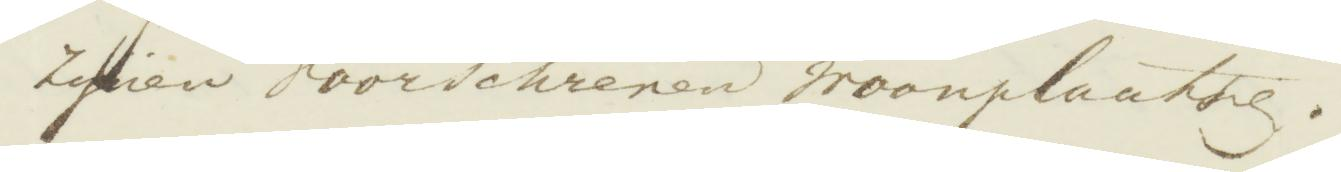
zestien voorschreven woonplaatse.
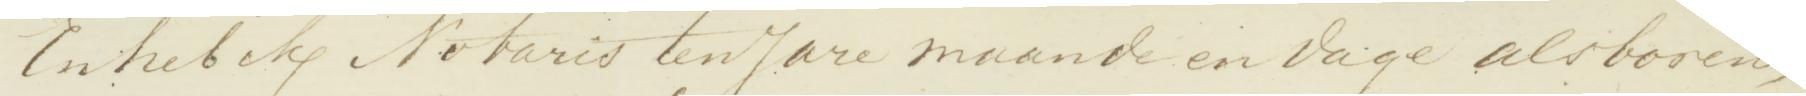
En heb ik Notaris ten Jare maande en dage als boven,
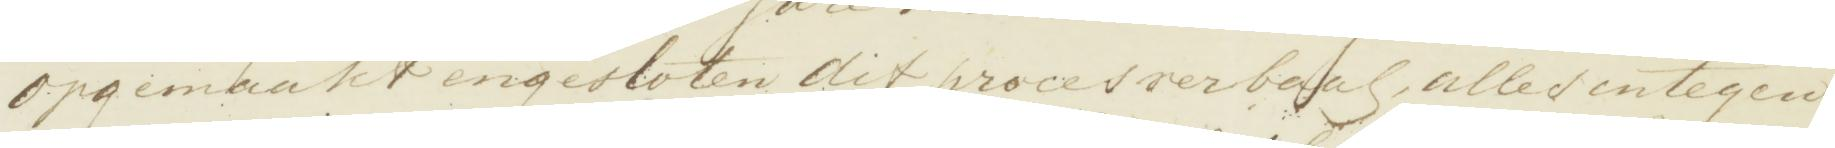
opgemaakt en gesloten dit proces verbaal, alles in tegen
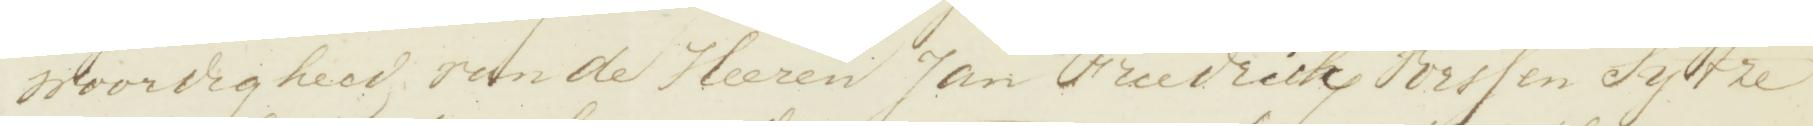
woordigheid van de Heeren Jan Freedrick Vorssen Sytze
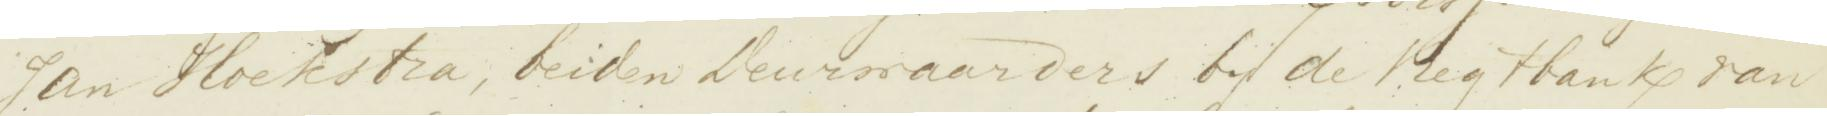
Jan Hoekstra, beiden Deurwaarders bij de Regtbank van
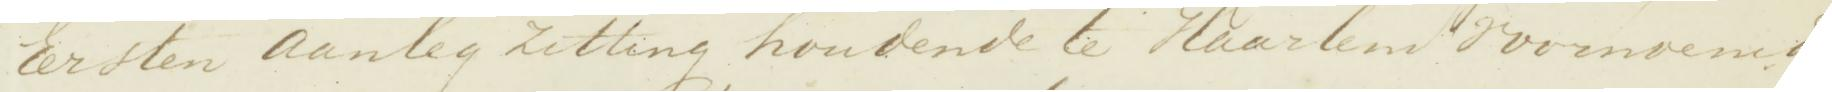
Eersten aanleg zitting houdende te Haarlem voornoemd
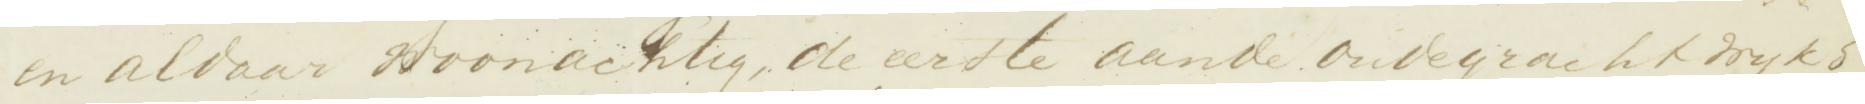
en aldaar woonachtig, de eerste aan de oude gracht wyk 5
